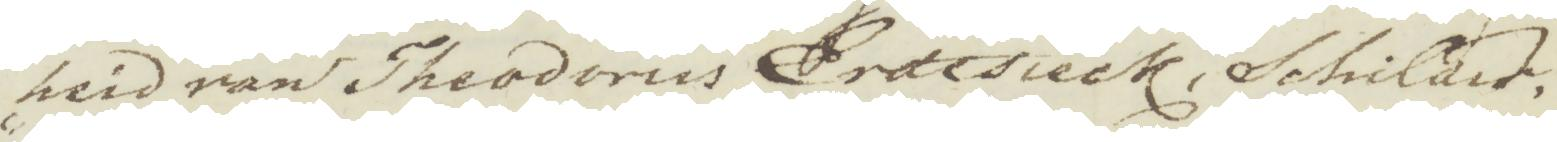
heid van Theodorus Erdtsieck, Schilder,
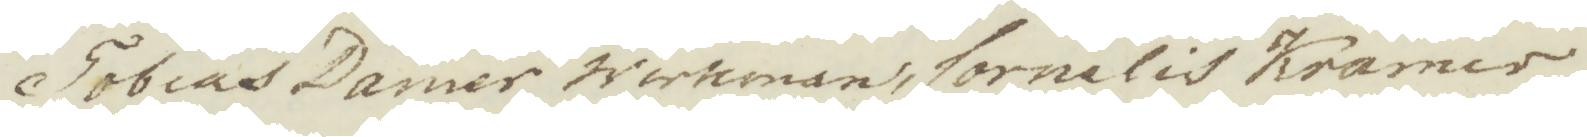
Tobias Damer Werkman, Cornelis Kramer
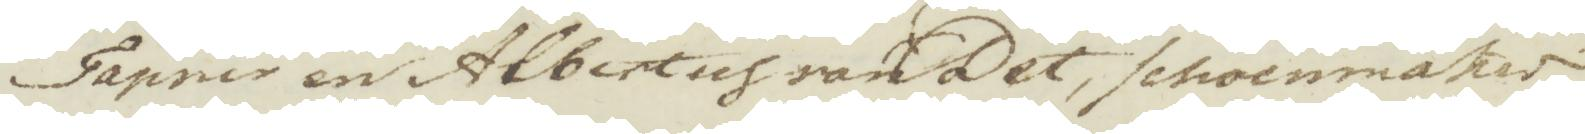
Tapper en Albertus van Det, schoenmaker,
